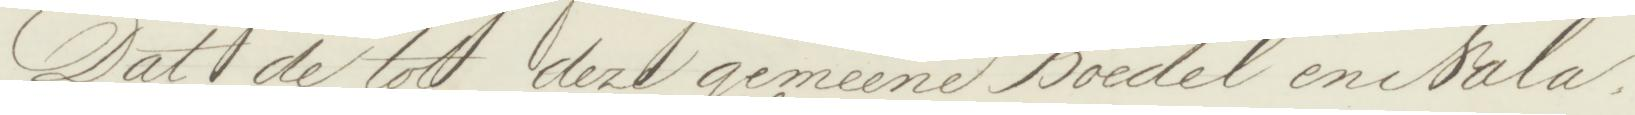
Dat de tot der gemeene Boedel en Nala„
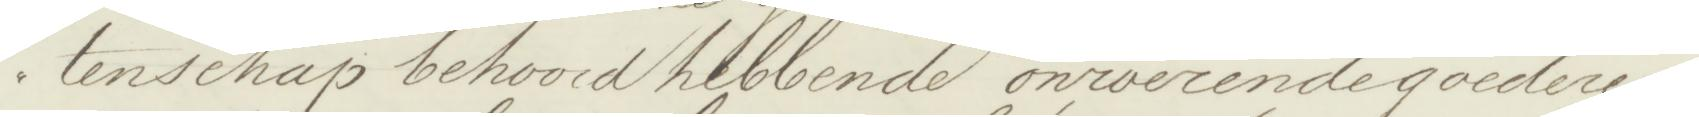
„tenschap behoord hebbende onroerende goederen,
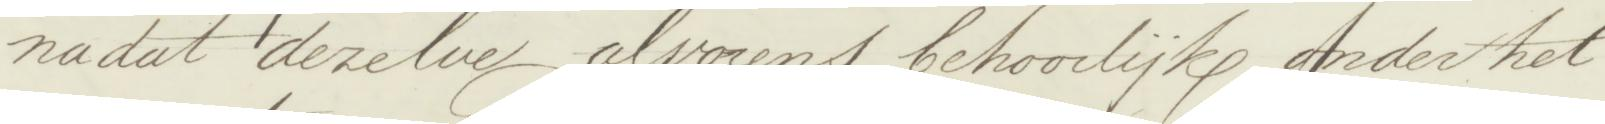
nadat dezelve alvorens behoorlijk onder het
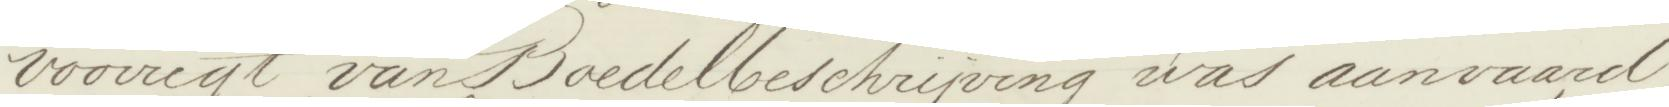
voorregt van Boedelbeschrijving was aanvaard,
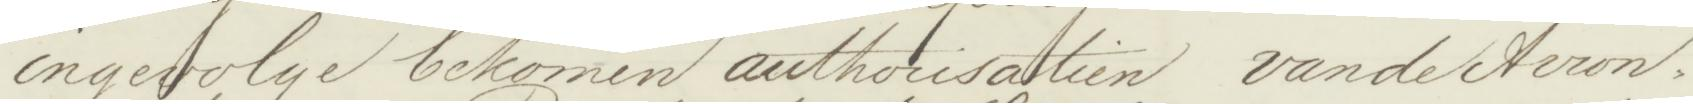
ingevolge bekomen authorisatien van de Arron„
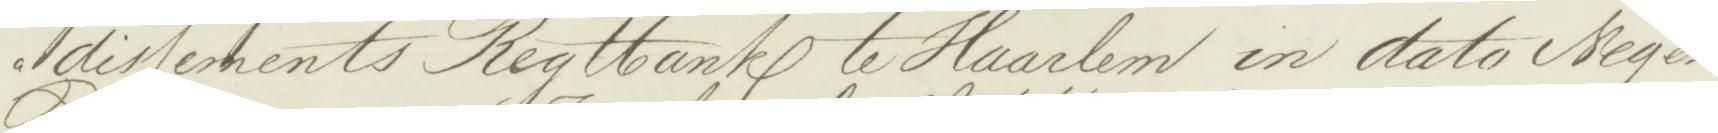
dissements Regtbank te Haarlem in dato Negen
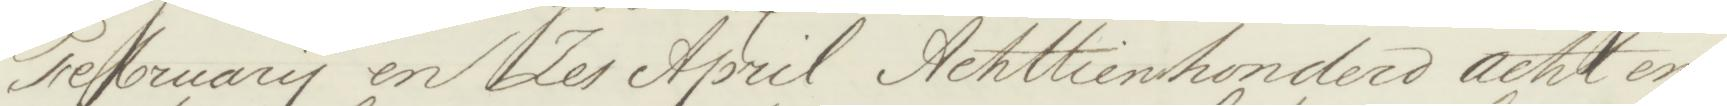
Februarij en Zes April Achttienhonderd acht en
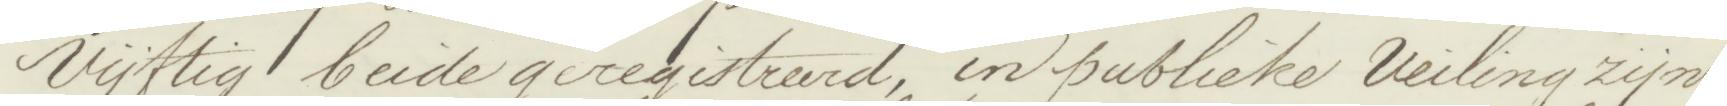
Vijftig beide geregistreerd, in publieke Veiling zijn
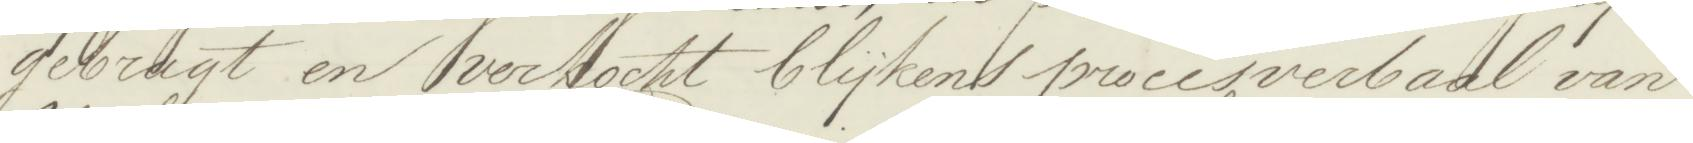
gebragt en verzocht blijkens proces verbaal van
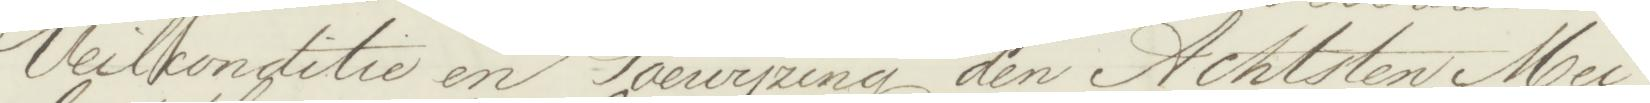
Veilconditie en Toewijzing den Achtsten Mei
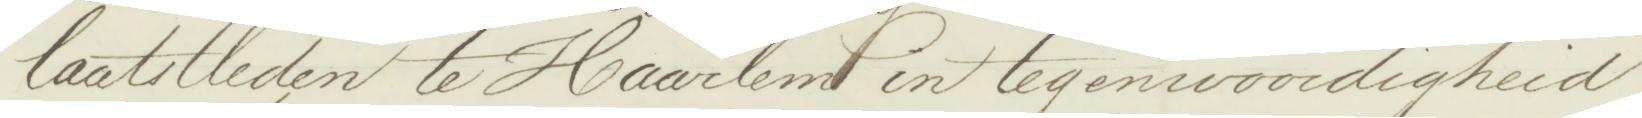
laatstleden te Haarlem in tegenwoordigheid
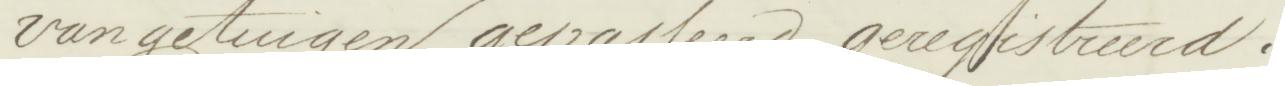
van getuigen gepasseerd, geregistreerd.
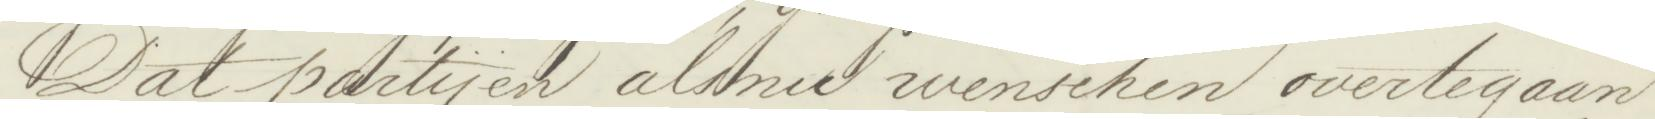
Dat partijen al nu wenschen overtegaan
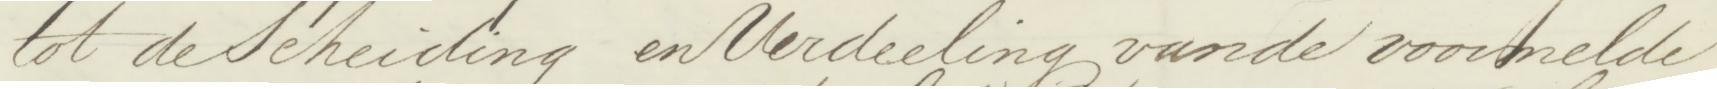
tot de scheiding en Verdeeling van de voormelde
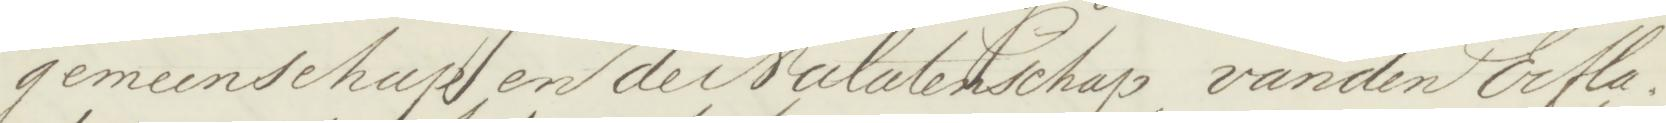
gemeenschap en de Nalatenschap van den Erfla„
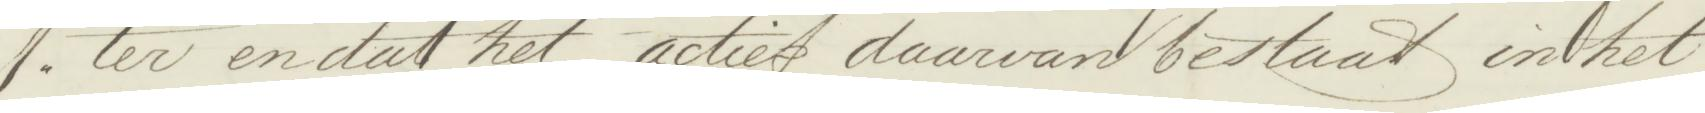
„ter en dat het actief daarvan bestaat in het
